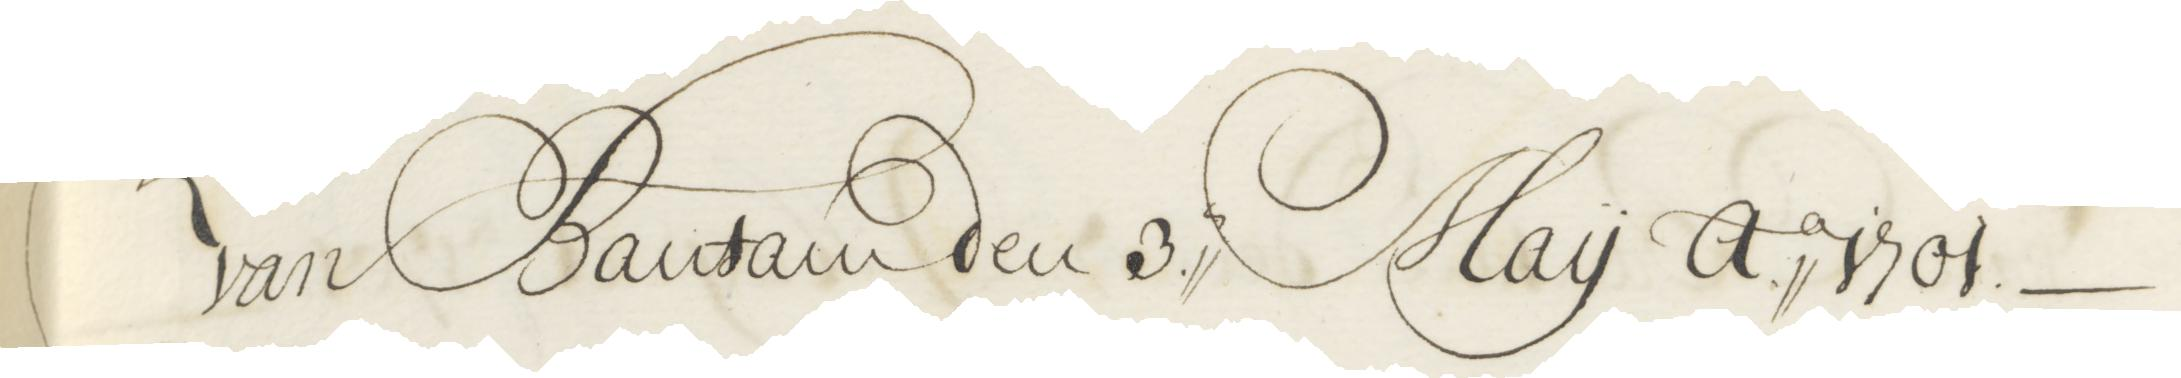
Van Bantam den 3.„n Maij A„o 1701. —
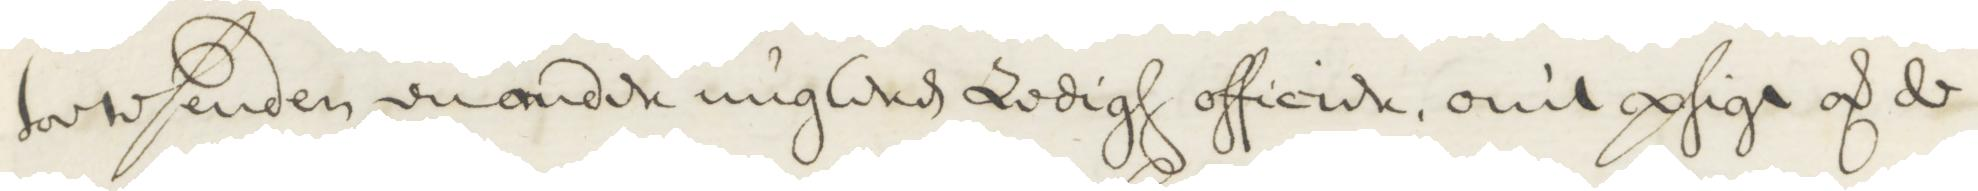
toe te senden en onder nugteren zedigh officier, om 't opsigt over de
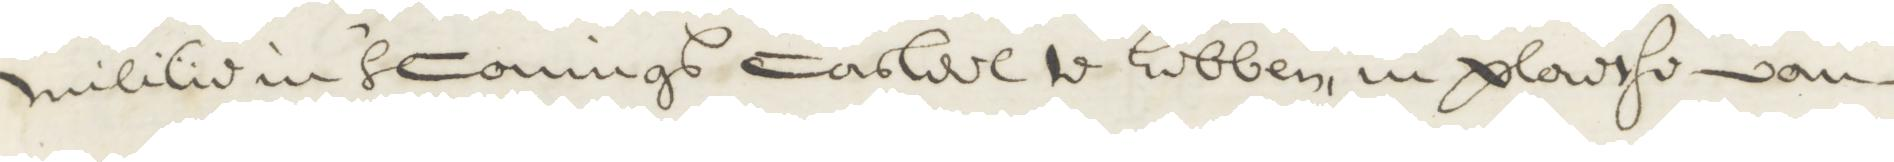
militie in 's conings casteel te hebben, in plaetse van
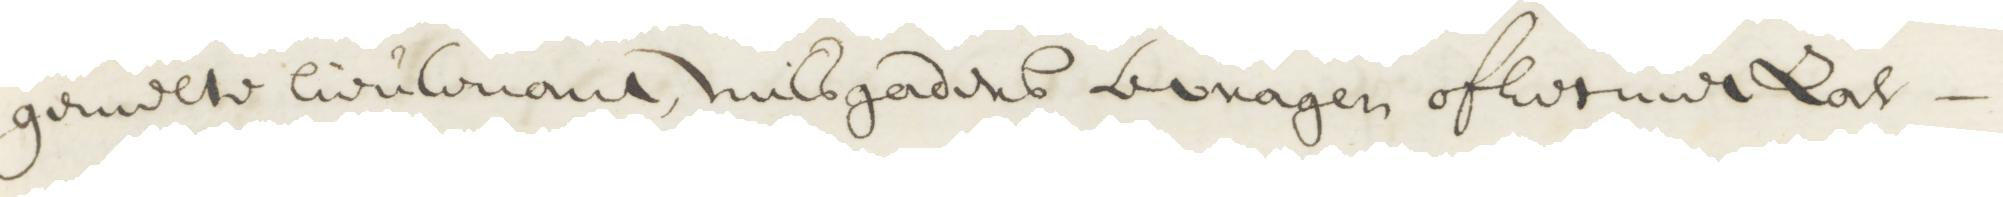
gemelte lieutenant, mitsgaders te vragen of het niet zal —
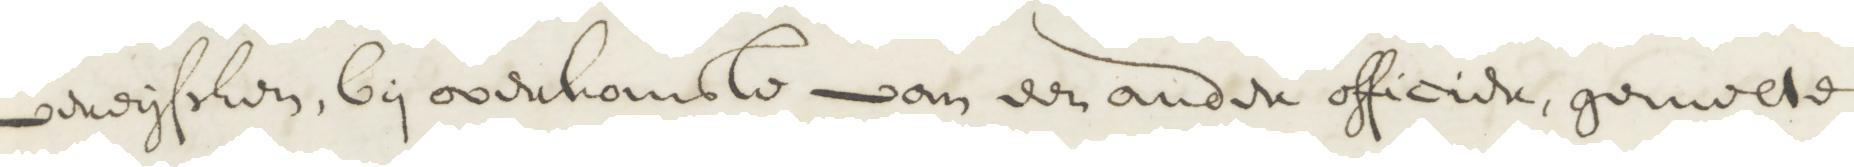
vereijschen, bij overkomste van een ander officier, gemelte
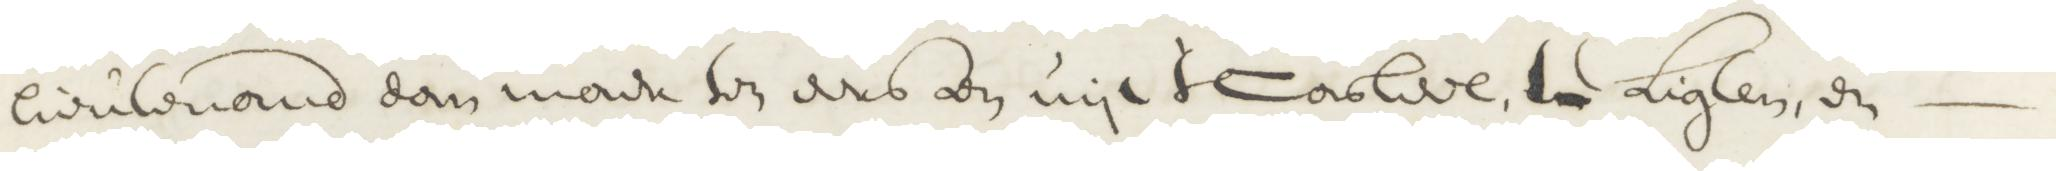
lieutenand dan maer ten eersten uijt 't Casteel, te ligten, en —
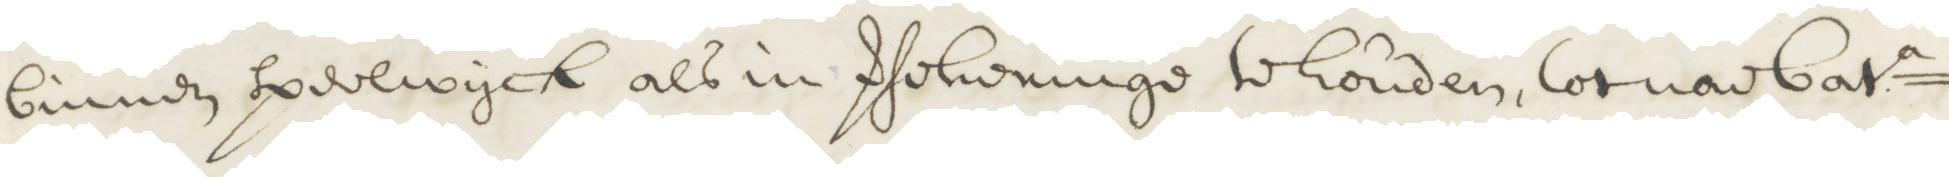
binnen speelwijck als in versekeringe te houden, tot nae bat=a
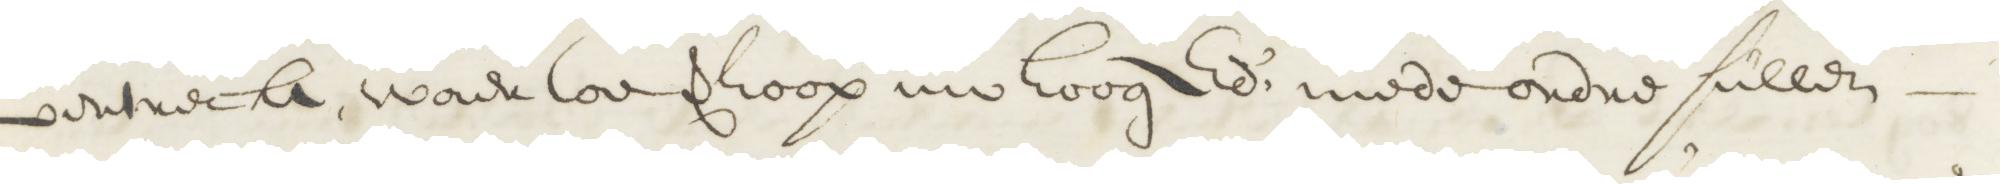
vertreckt, waer toe verhoop uw hoog Ed': mede ordre sullen —
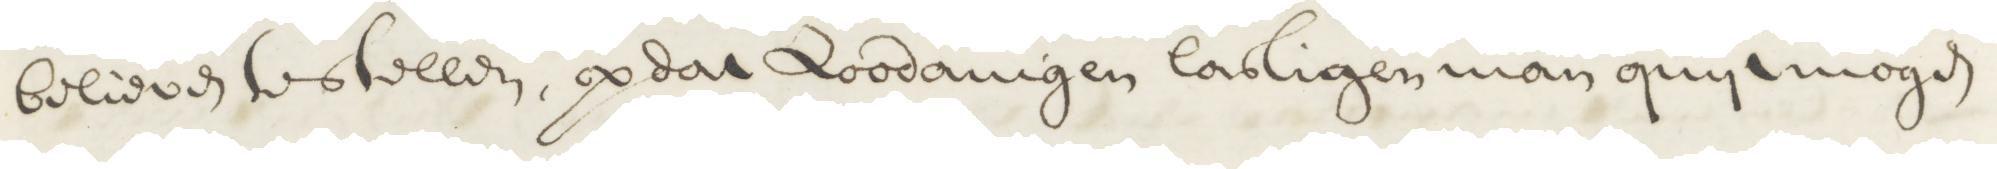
believen te stellen, op dat zoodanigen lastigen man quijt mogen
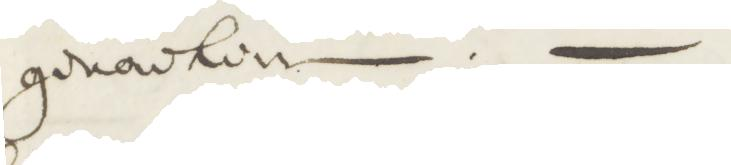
geraeken. —
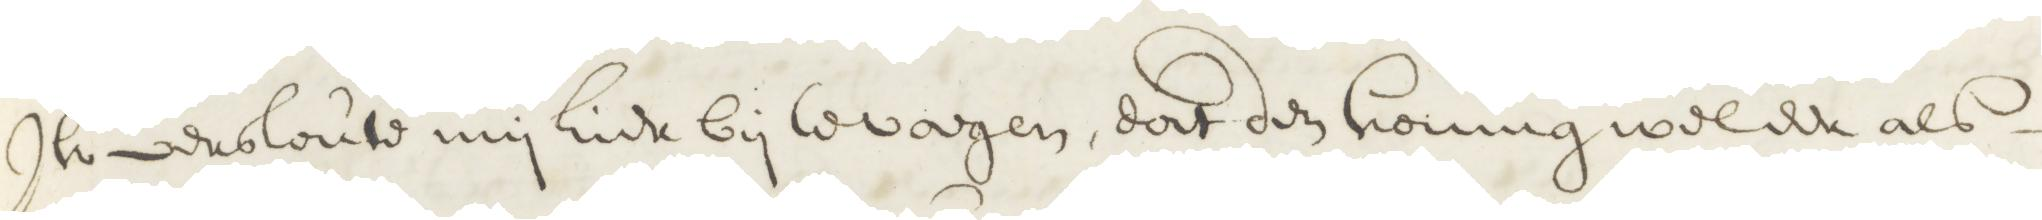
Ik verstoute mij hier bij tevoegen, dat den koning wel eer als
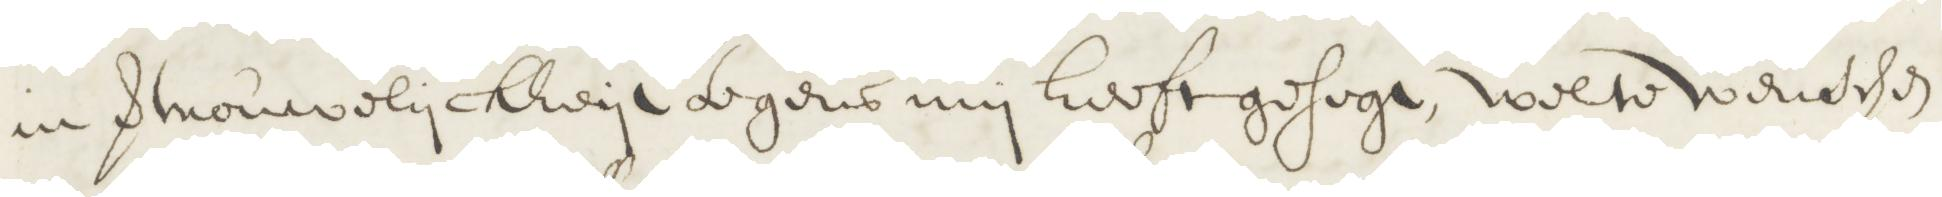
in vertrouwelijckheijt tegens mij heeft gesegt, wel te wenschen
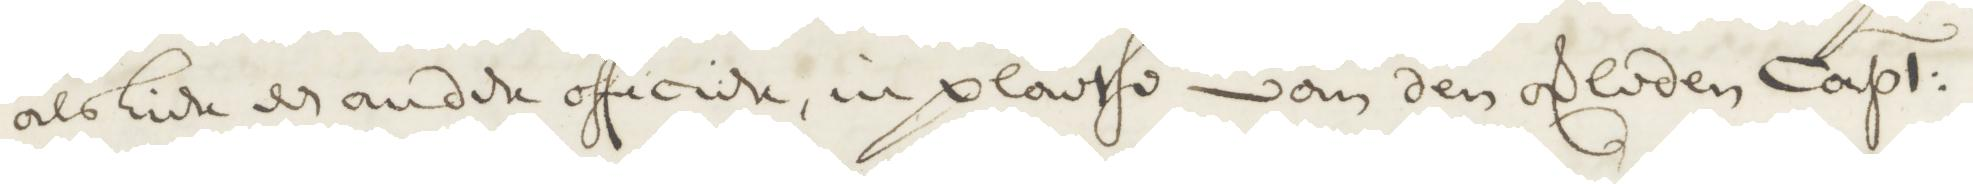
als hier een ander officier, in plaetse van den overleden Capt:
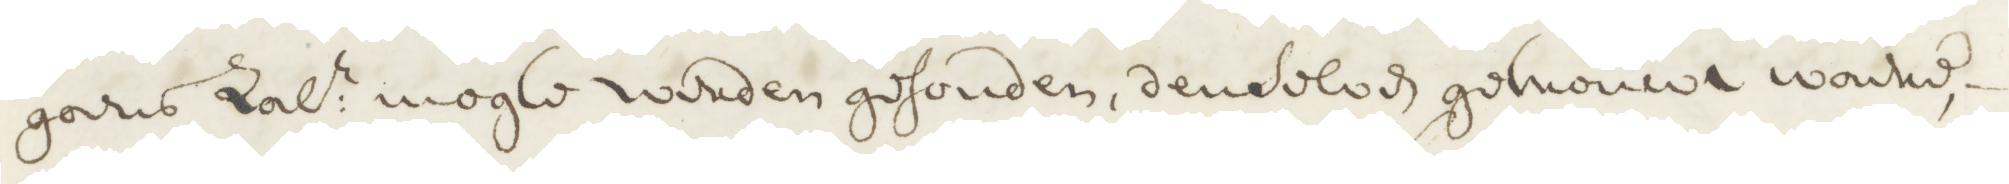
goens zal:r mogte werden gesonden, denselven getrouwt waere, —
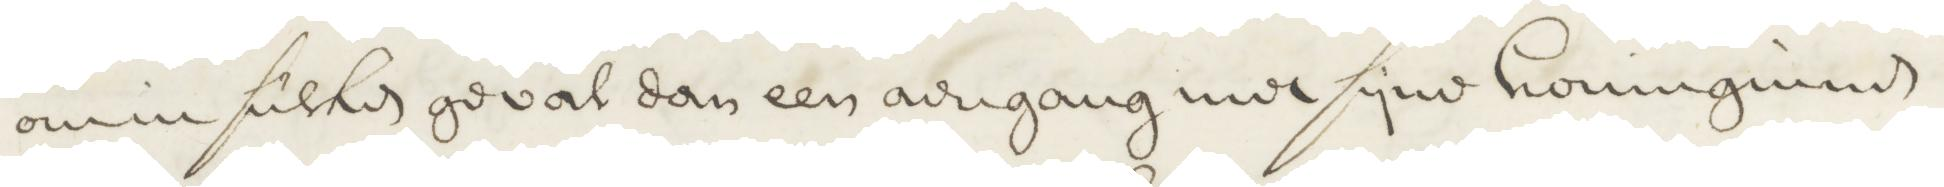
om in sulken geval dan een aengang met sijne koninginnen
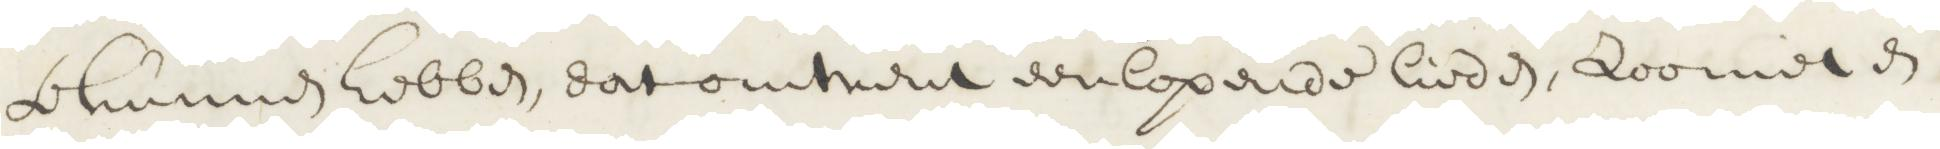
te kunnen hebben, dat omtrent een lopende lieden, zoo niet en
